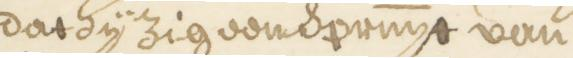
dat hij zig een spruijt van
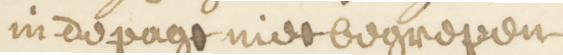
in de pagt niet begrepen
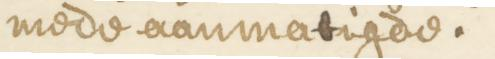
mede aanmatigde.
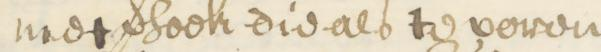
niet versook die als te voren
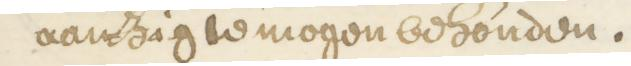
aan zig te mogen behouden.
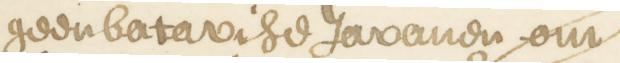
geen batavise Javanen om
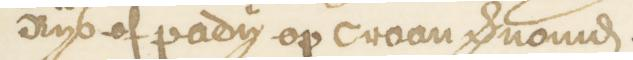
Rijs of padij op croon vernomen.
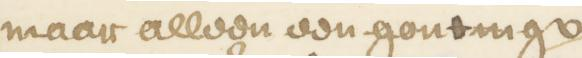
maar alleen een gonting v
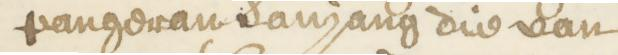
pangeran sanjang die van
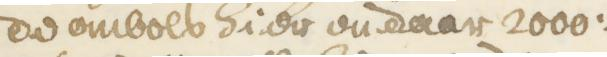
de ombols hier en daar 2000:
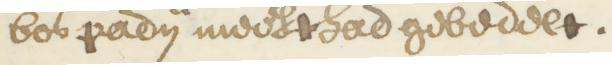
bos padij meest had gebedelt.
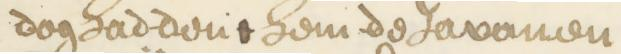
dog hadden t hem de Javanen
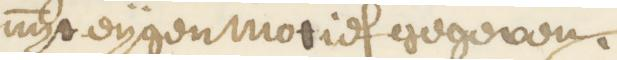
uijt eijgen motief gegeven.
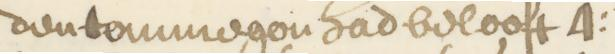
den tommegon had belooft 4:
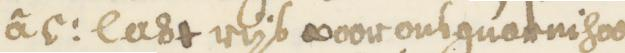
â 5: last rijs voor ons guarnisoe
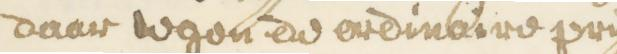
daar tegen de ordinaire pri
